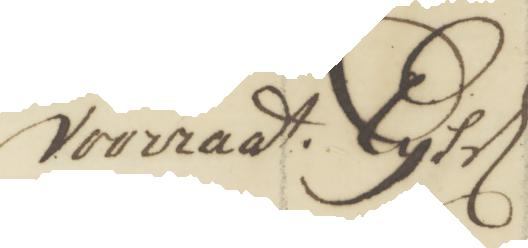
Vooraat. Eijsch
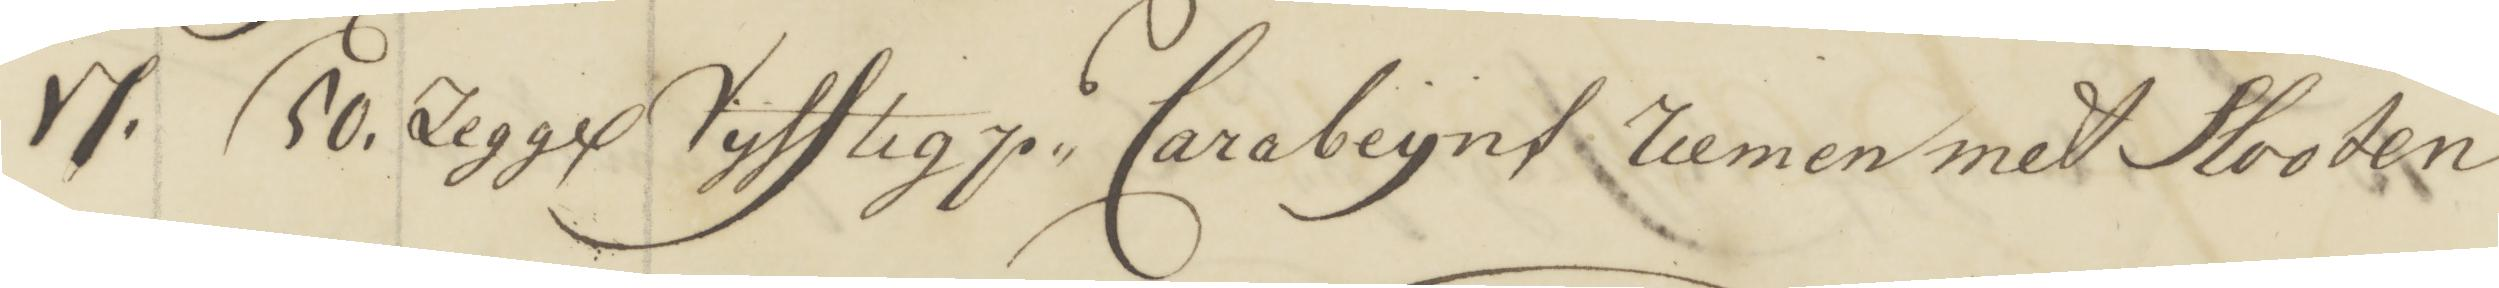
17. 50. zegge Vijfftig p„s Carabeijns riemen met slooten
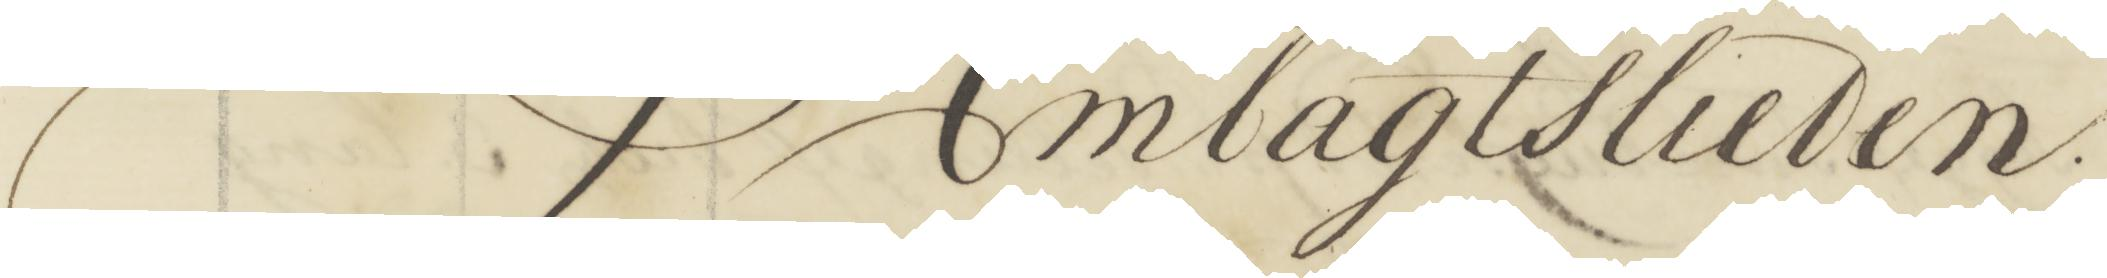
Ambagtslieden.
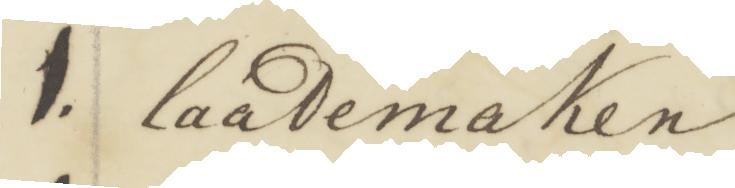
1. laademaker
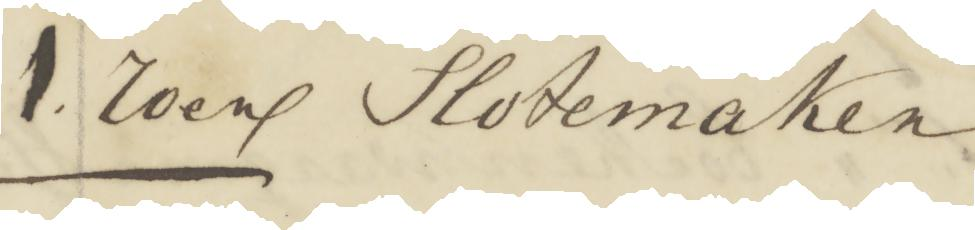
1. roer slotemaker
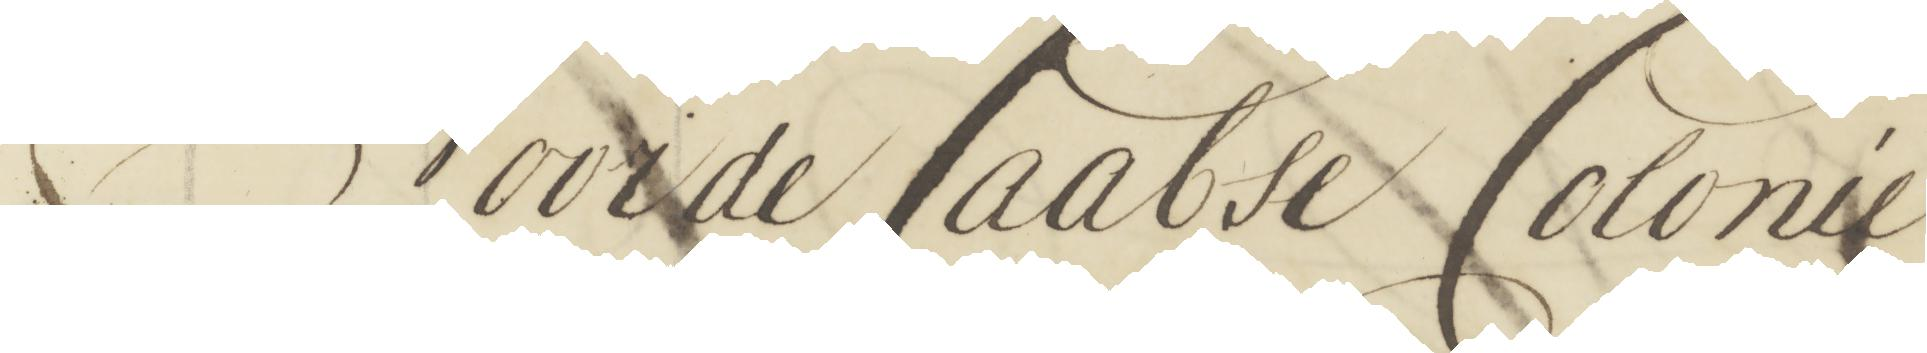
Voor de Caabse Colonie
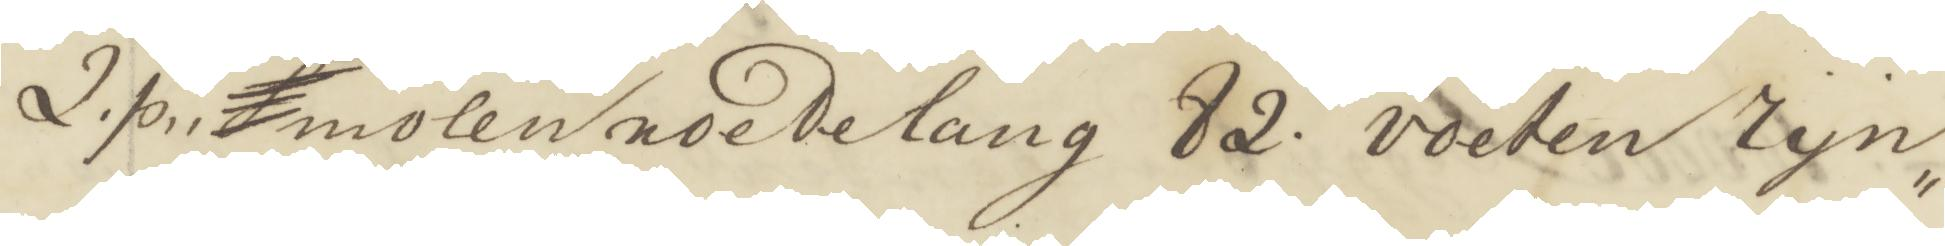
2. p„s smolen roede lang 82. voeten rijn„
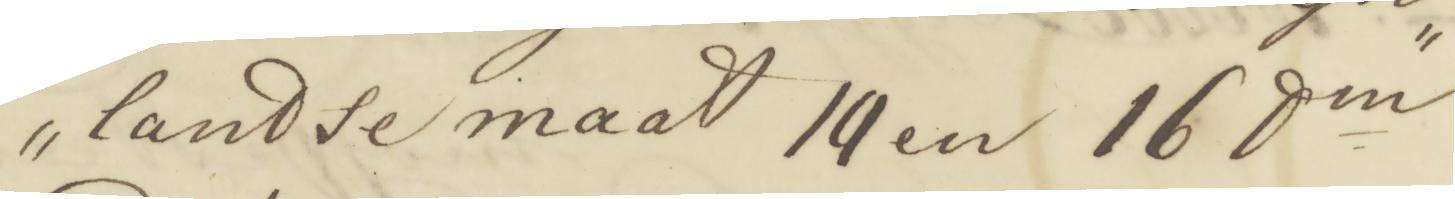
„landse maat 14 en 16 d=m
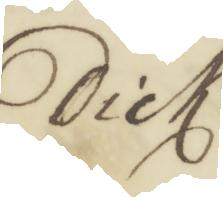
dick
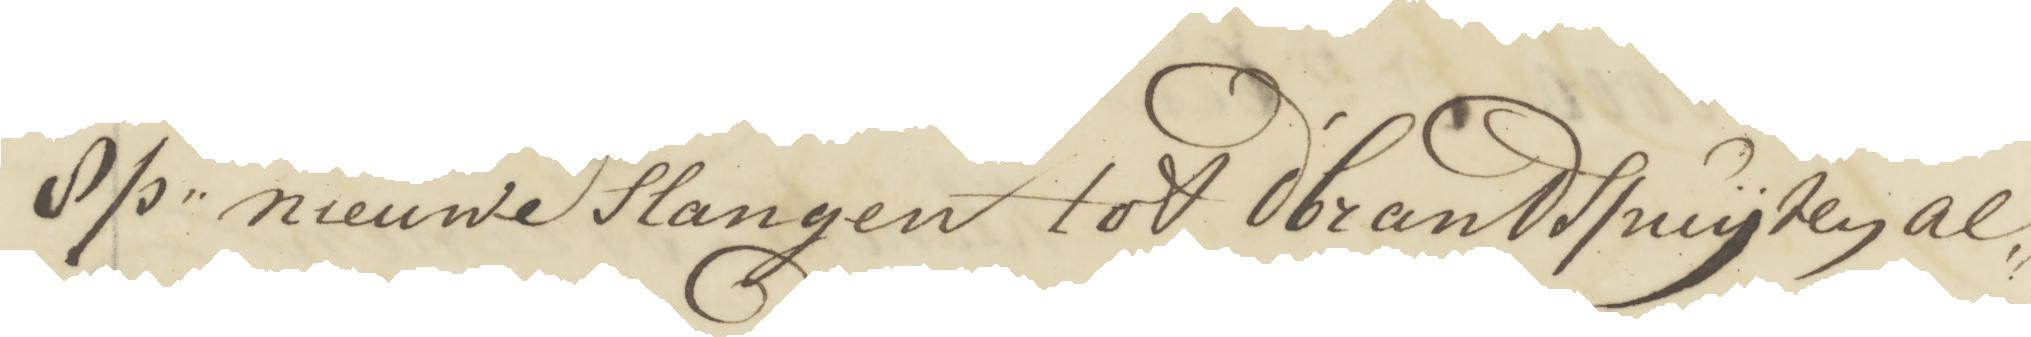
8 p„s nieuwe slangen tot d'brandspuijten al
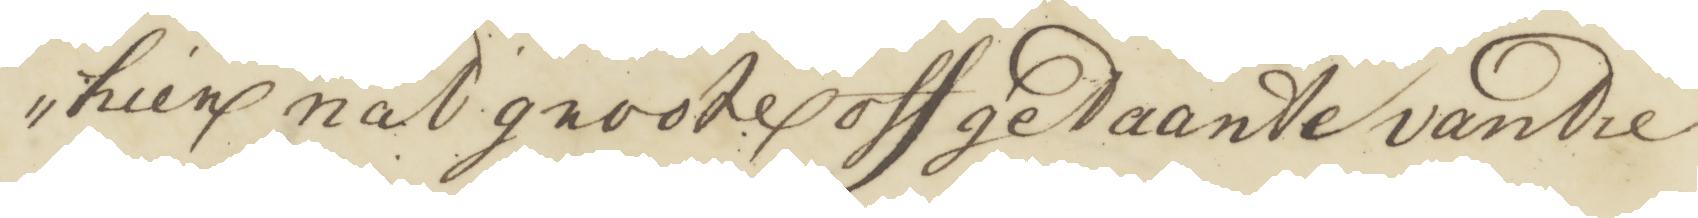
„hier nad' groote off gedaante van die
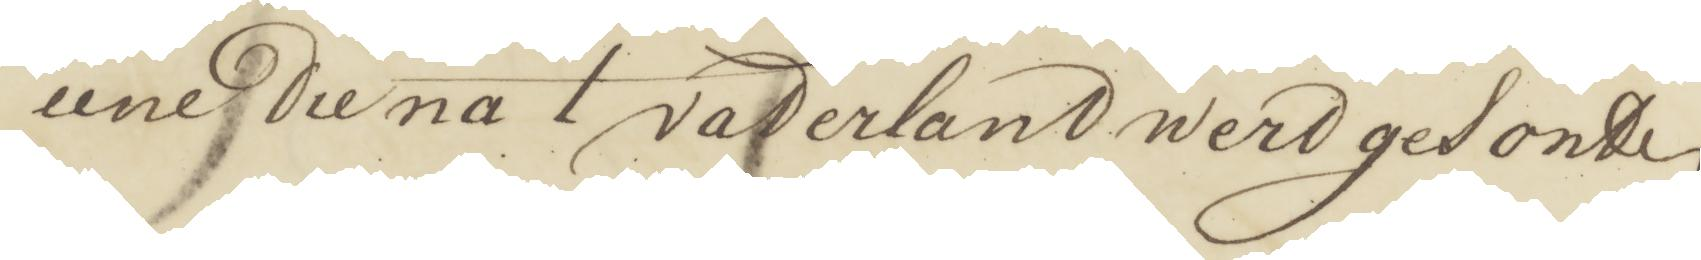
eene die na ’t vaderland werd gesonden
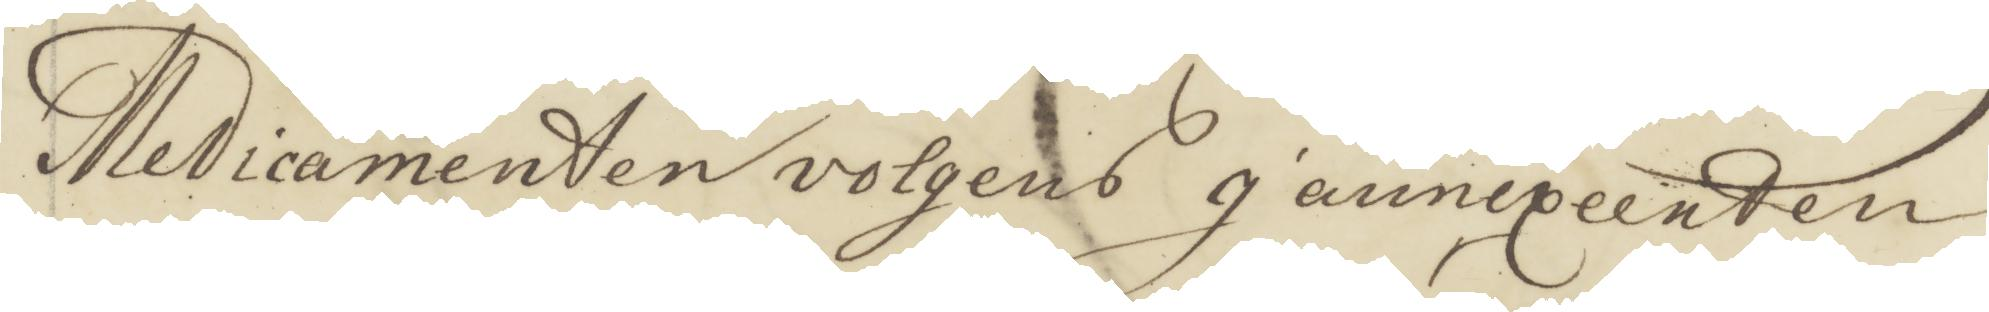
Medicamenten volgens g’annexeerden
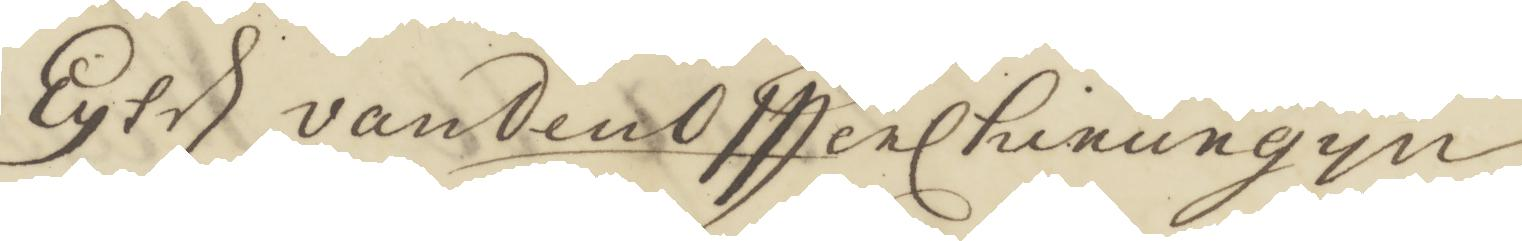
Eijsch van den opperchirurgijn
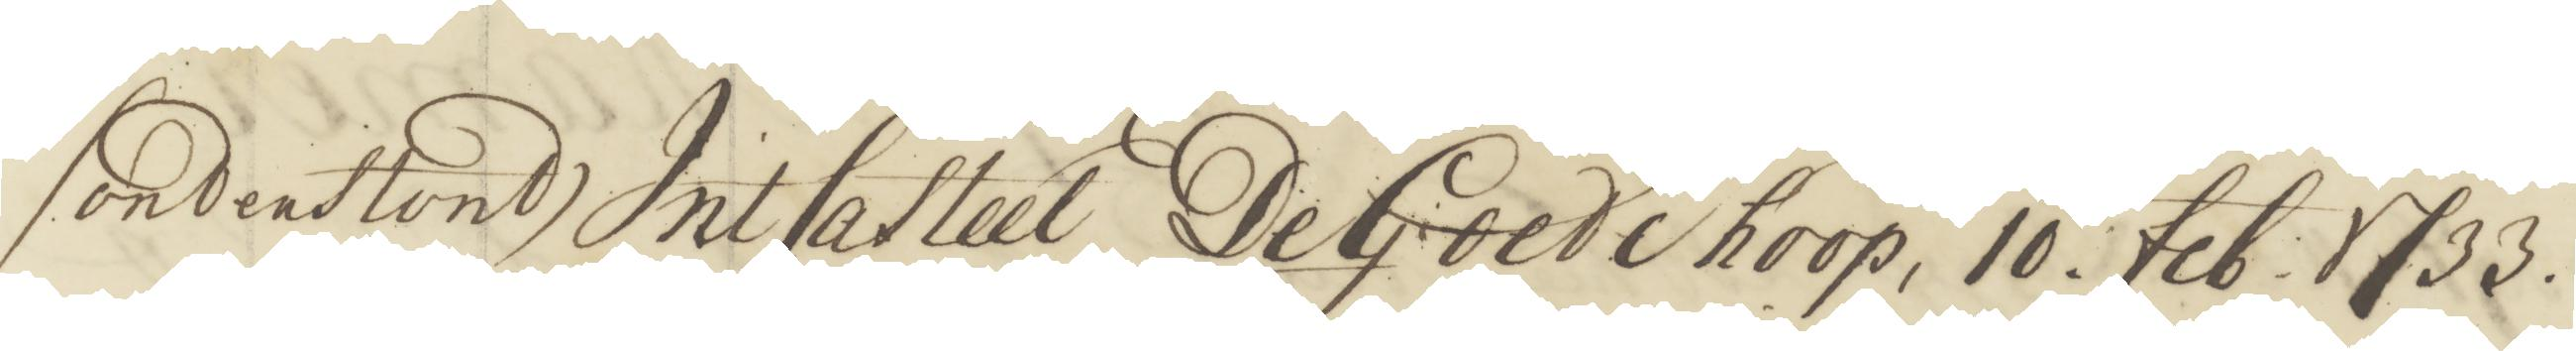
/onderstond/ In't Casteel De Goede hoop, 10.' feb: 1733.
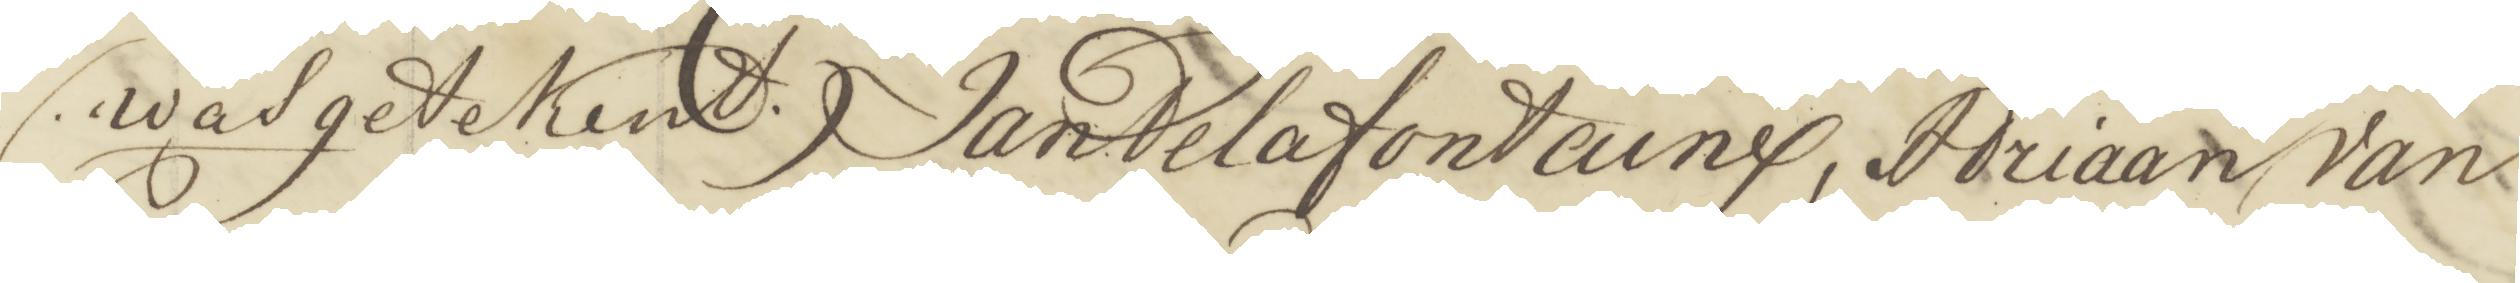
(:was getekent.) Ian dela fontaine, Adriaan van
